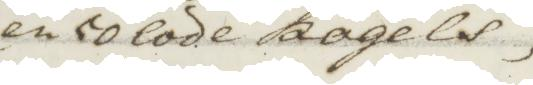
en 50 lode kogels
